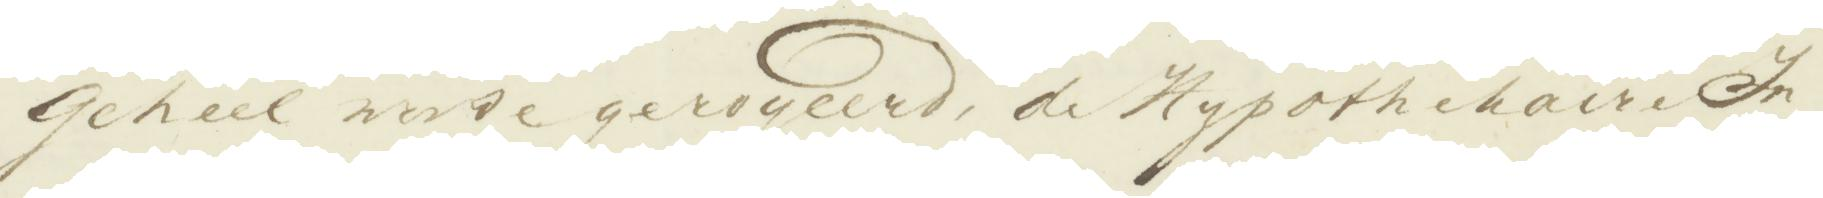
geheel werde geroyeerd, de Hypothekaire In
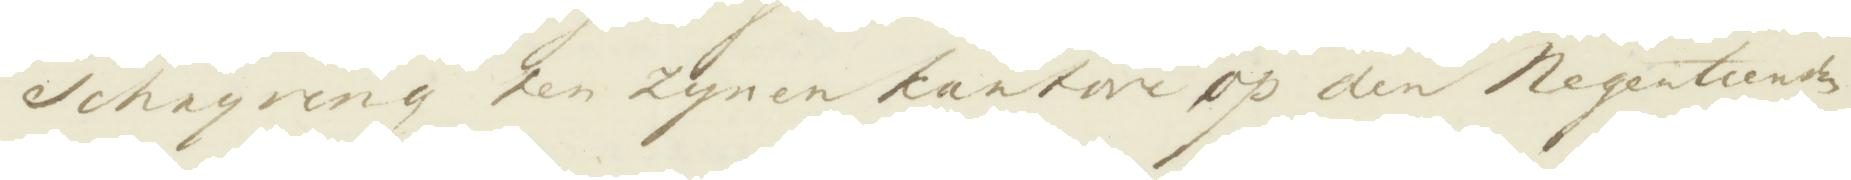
schryving ten zynen kantore op den Negentienden
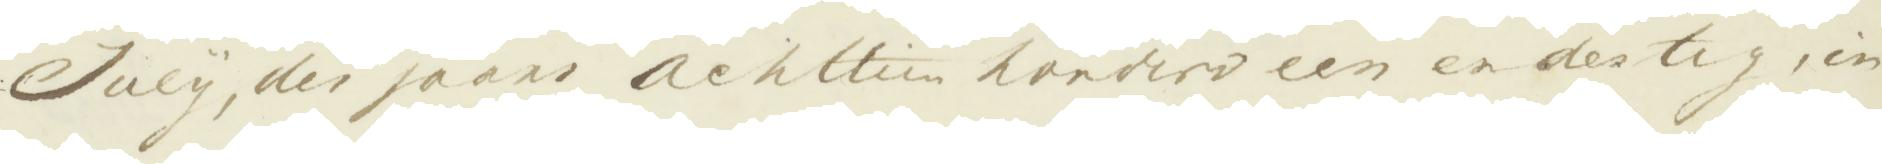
Iulij, des jaars achttien honderd een en dertig, in
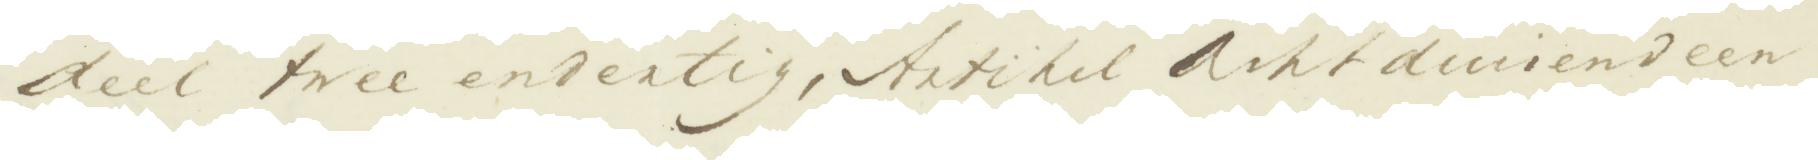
deel twee en dertig, Artikel acht duisend een
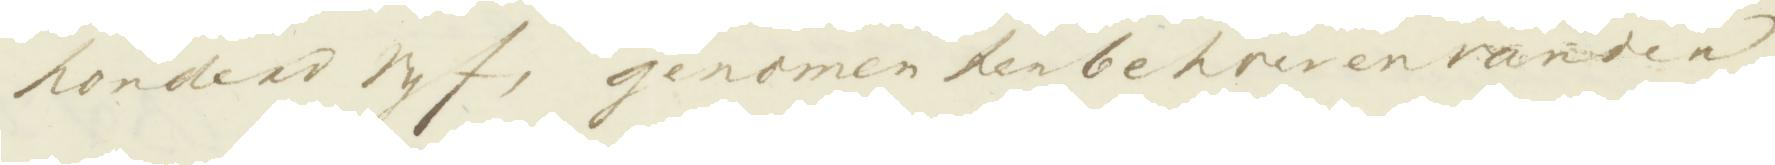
hondert vyf, genomen ten behoeven van den
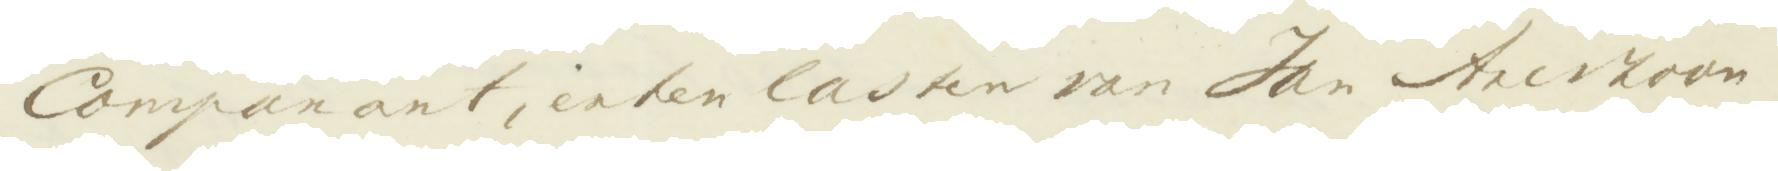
Comparant, en ten lasten van Jan Ariszoon
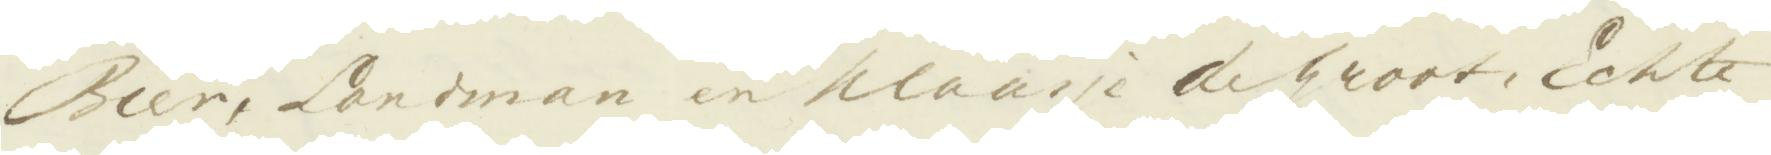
Bier, Landman en klaasje de Groot, Echte
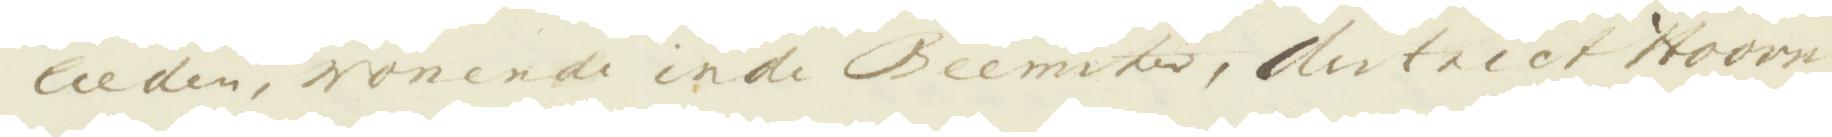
lieden, wonende in de Beemster, district Hoorn,
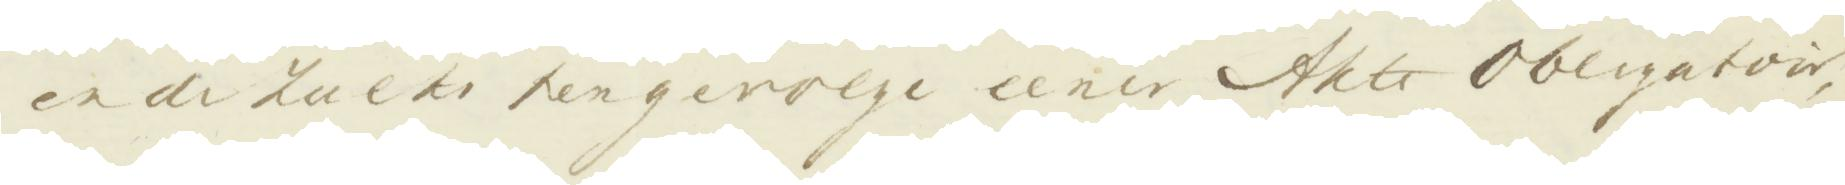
en de zulks ten gevolge eener Akte Obligatoir,
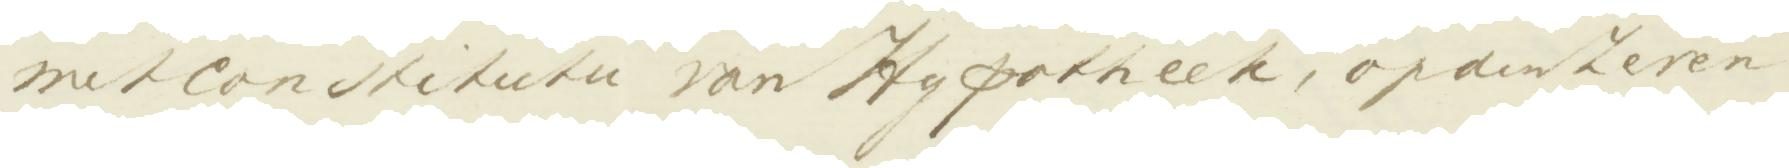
met constitutie van Hypotheek, op den zeven
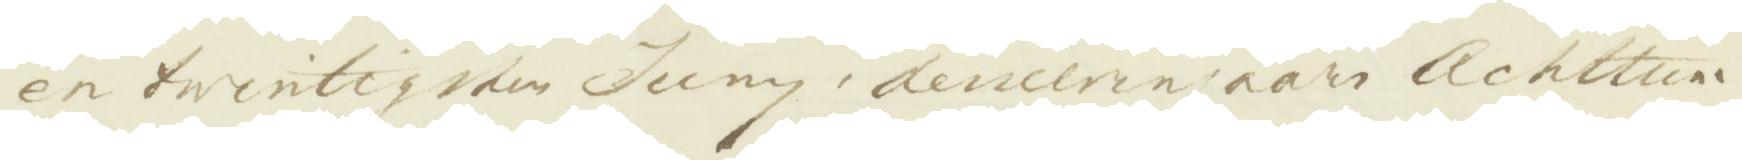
en twintigsten Iuny, desselven jaars Achttien
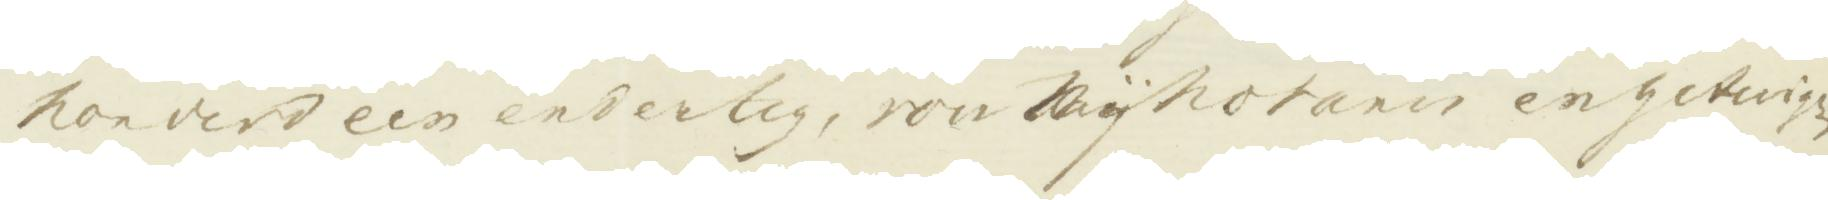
honderd een endertig, voor mij notaris en getuijgen
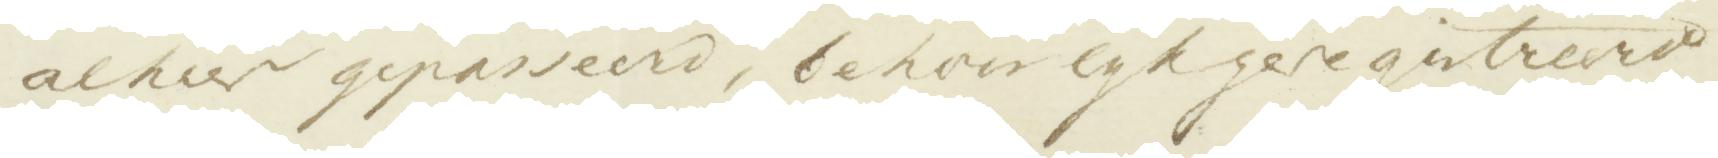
alhier gepaseerd, behoorlyk geregistreerd,
